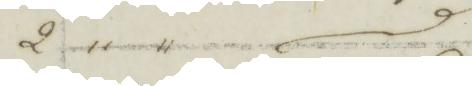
2 „ „ _o
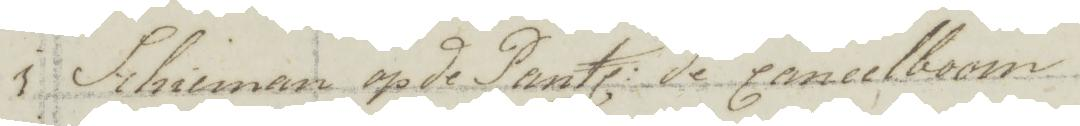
1 Schieman op de Pantc: de caneelboom
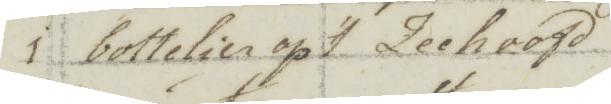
1 bottelier op ’t Zeehoofd
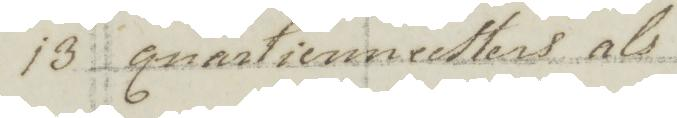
13. quartiermeesters als
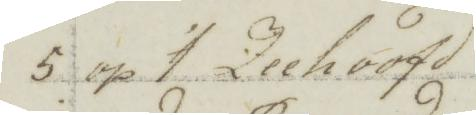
5 op 't Zeehoofd
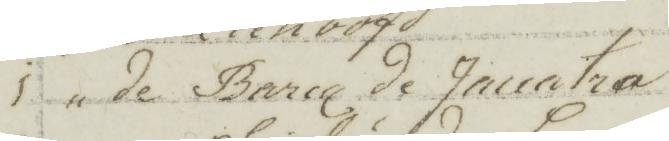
1 „ de Barcq de Jaccatra
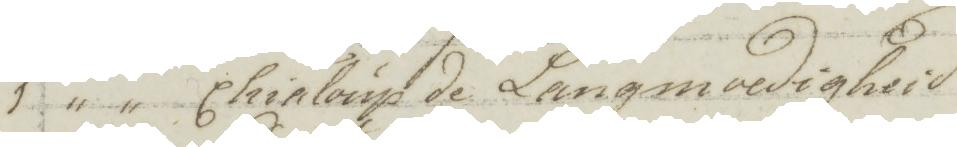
1 „ „ chialoup de Langmoedigheid
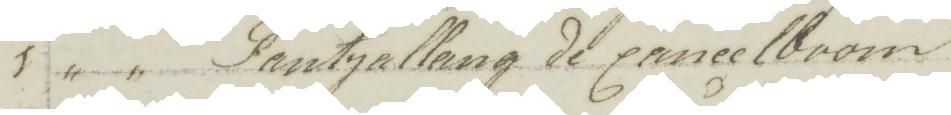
1 „ „ Pantjallang de caneelboom
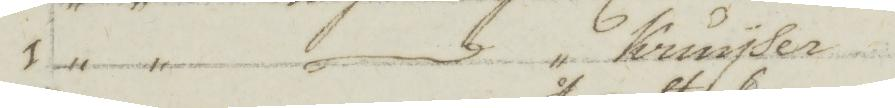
1 „ „ _o kruijser
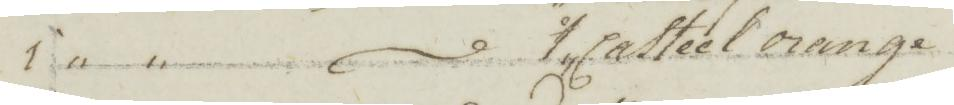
1 „ „ _o 't„casteel orange
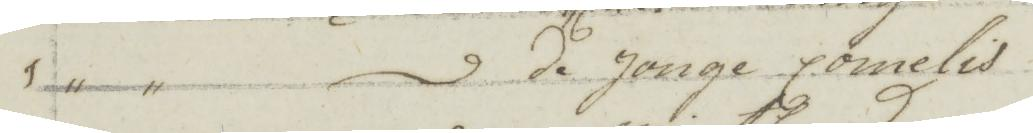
1 „ „ _o de Jonge cornelis
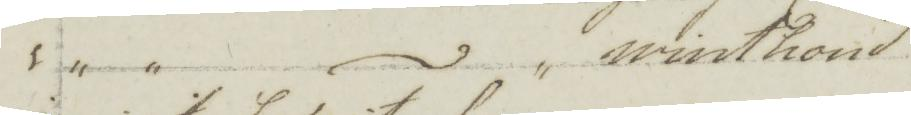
1 „ „ _o „ winthond
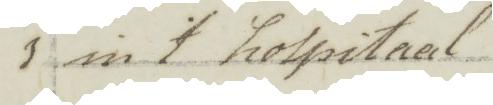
1 in ’t hospitaal
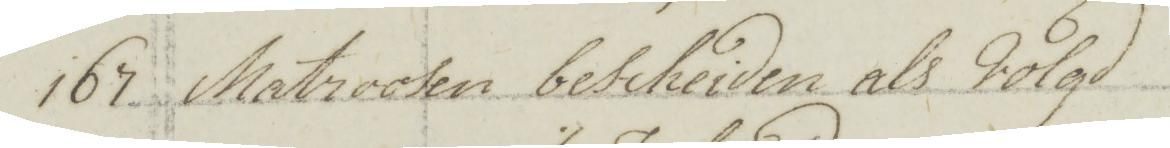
167. Matroosen bescheiden als volgd
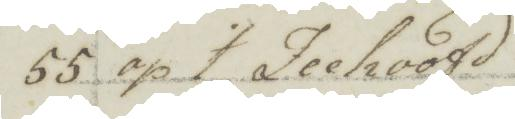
55 op ’t Zeehoofd
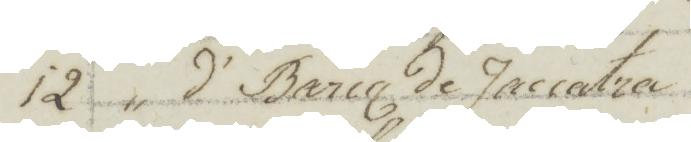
12 „ d' Barcq de Jaccatra
